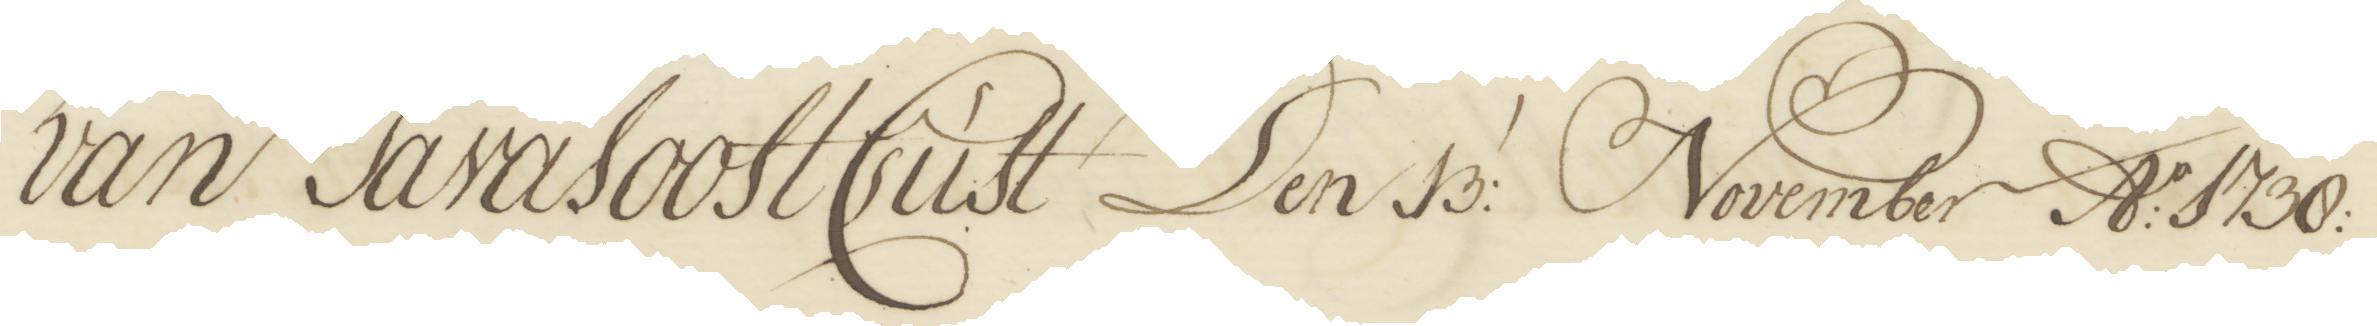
Van Iava's oost Cust Den 13:' November A:o 1738:
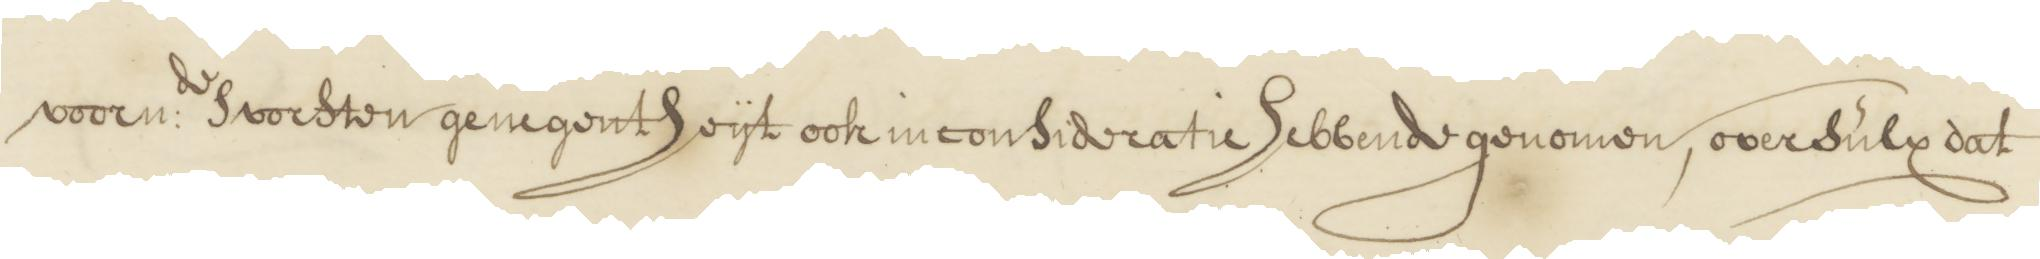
voorn: de 's vorsten genegentheijt ook in consideratie hebbende genomen, over sulx dat
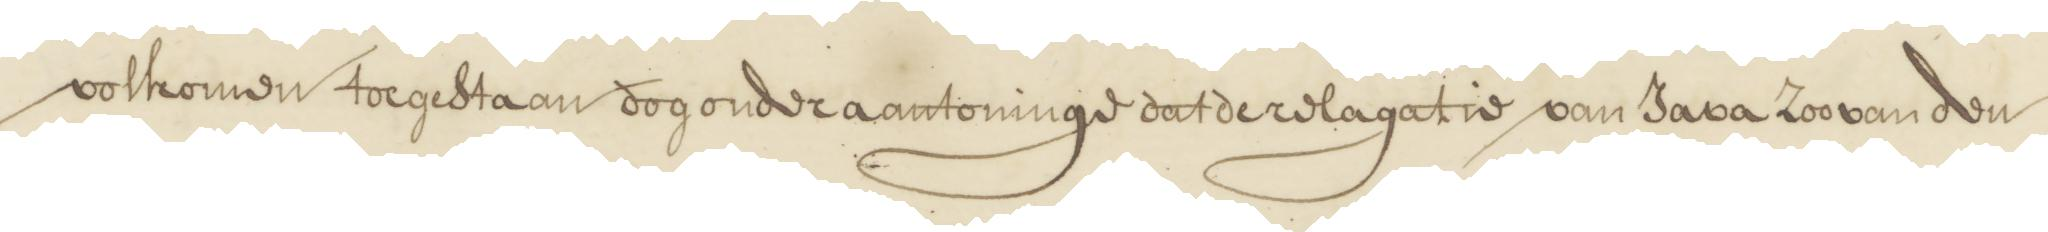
volkomen toegestaan dog onder aantoninge dat de relagatie van Iava zoo van den
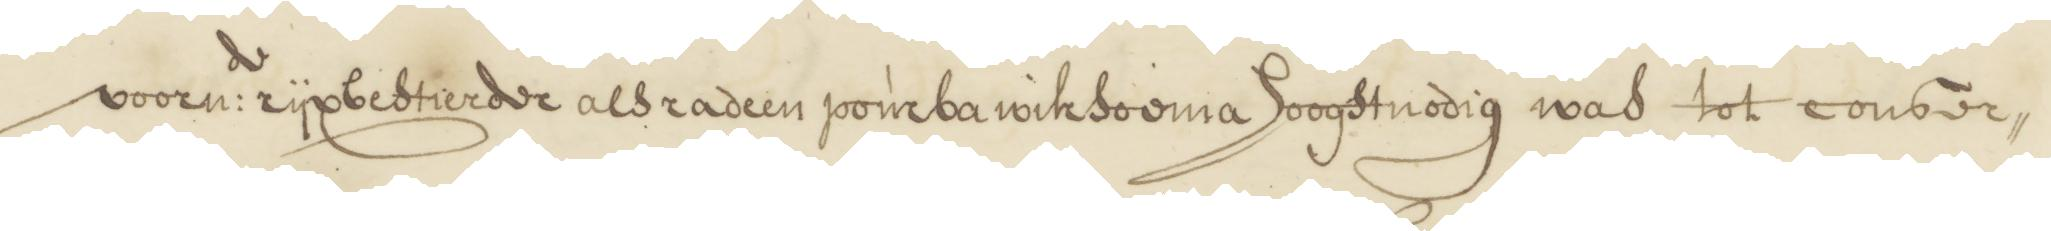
voorn:de rijxbestierder als radeen pourba wiksoema hoogstnodig was tot conser„
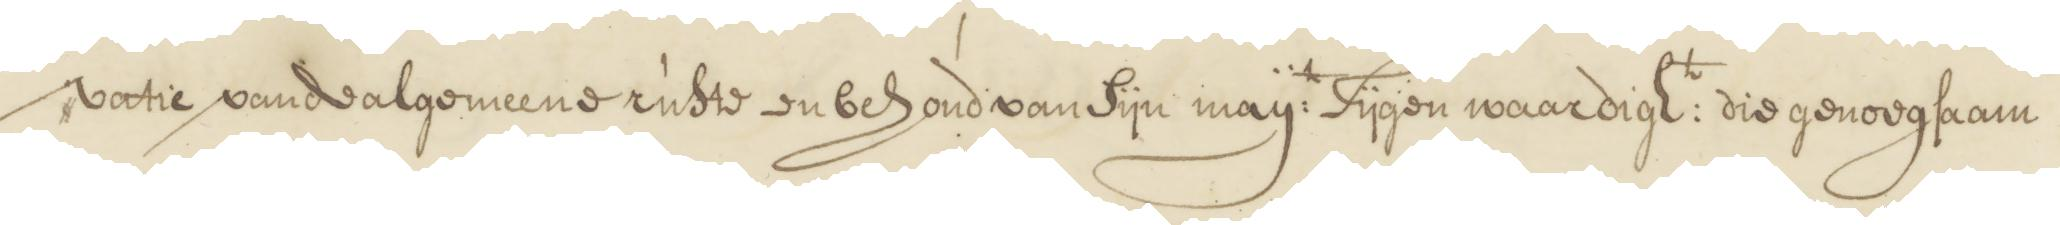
„vatie van de algemeene ruste en behoud van sijn maij:t Eijgen waardigh:t die genoegsaam
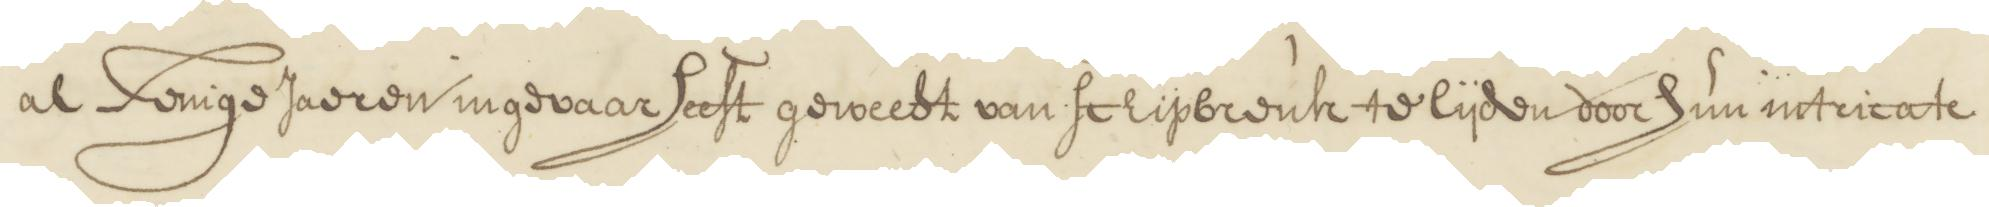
al Eenige Jaeren ingevaar heeft geweest van schipbreuk te lijden door hun intricate
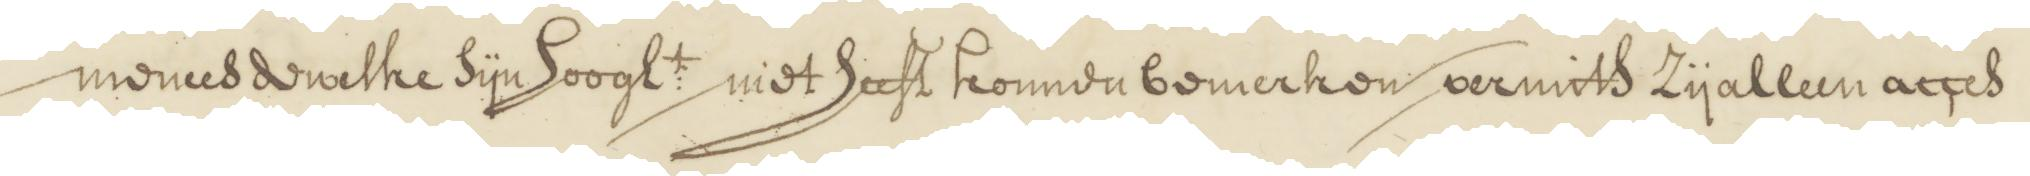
menees dewelke sijn hoogh:t niet heeft konnen bemerken vermits zij alleen acces
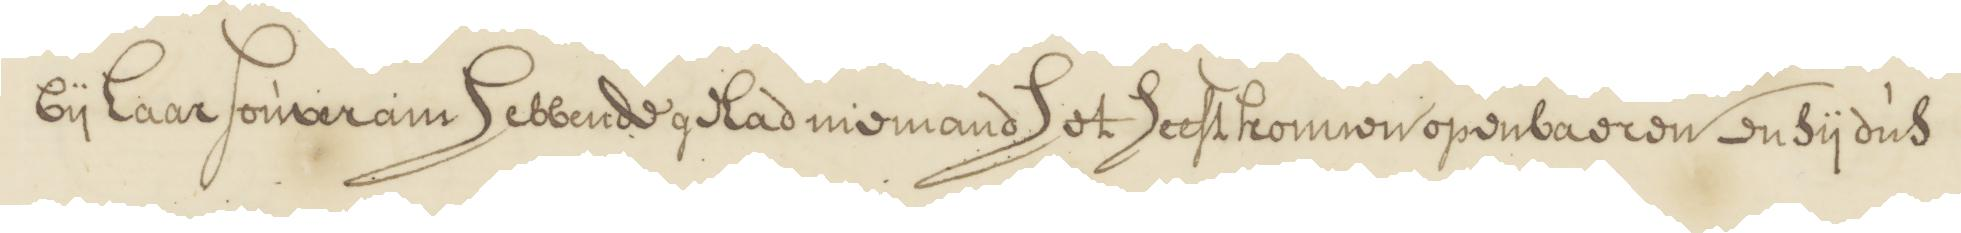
bij haar souverain hebbende gehad niemand het heeft konnen openbaeren en sij dus
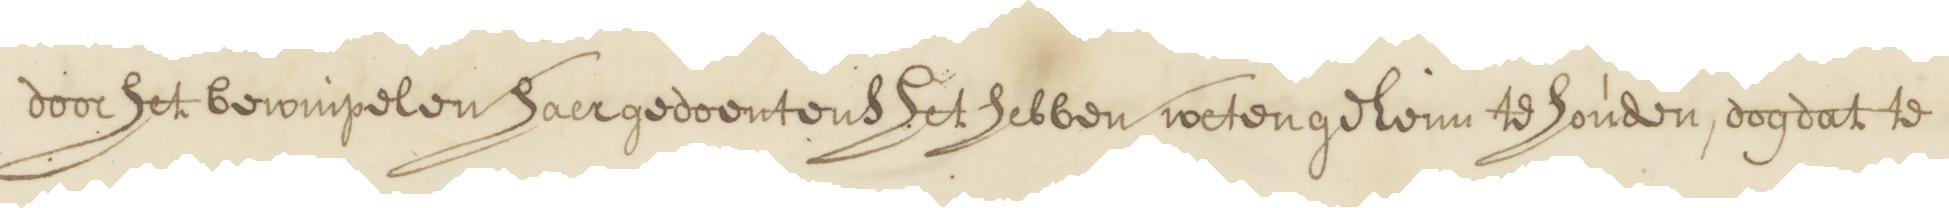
door het bewimpelen haer gedoentens het hebben weten geheim te houden, dog dat te
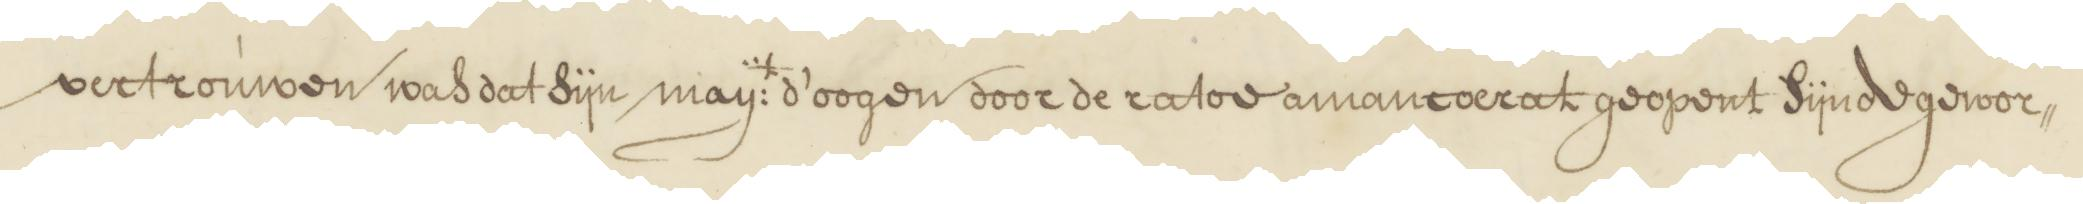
vertrouwen was dat sijn maij:t d’oogen door de ratoe amancoerat geopent sijnde gewor„
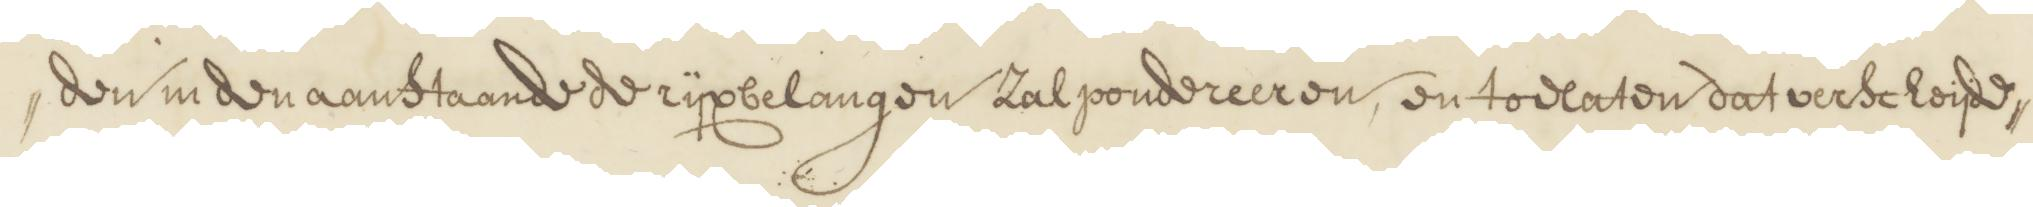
„den in den aanstaande de rijxbelangen zal pondereeren, en toelaten dat verscheijde„
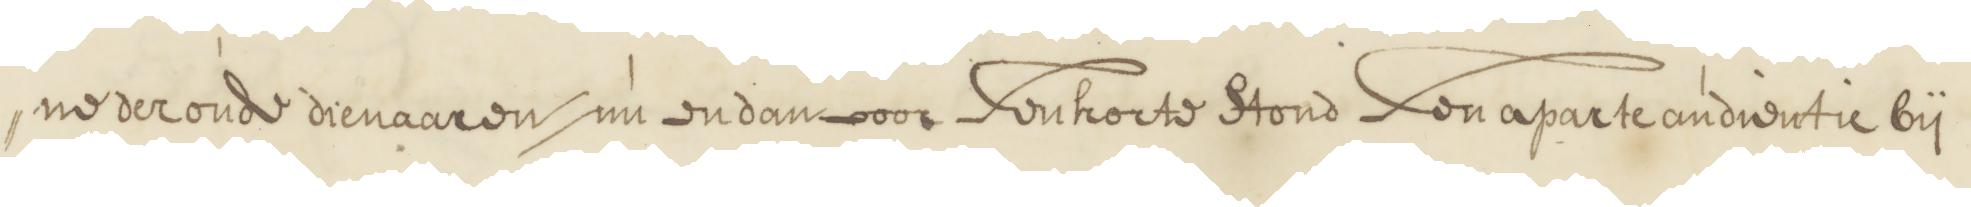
„ne der oude dienaaren nu en dan voor Een korte stond Een aparte audientie bij
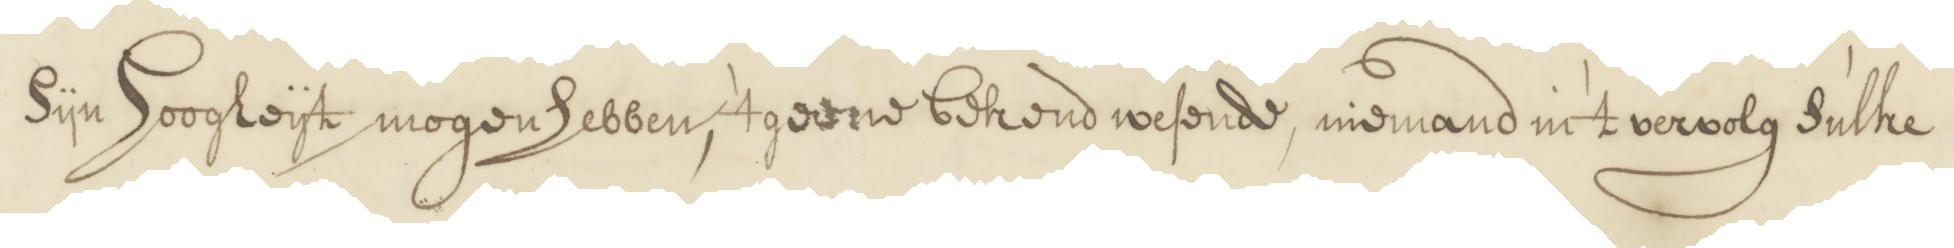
sijn hoogheijt mogen hebben, 't geene bekend wesende, niemand in ’t vervolg sulke
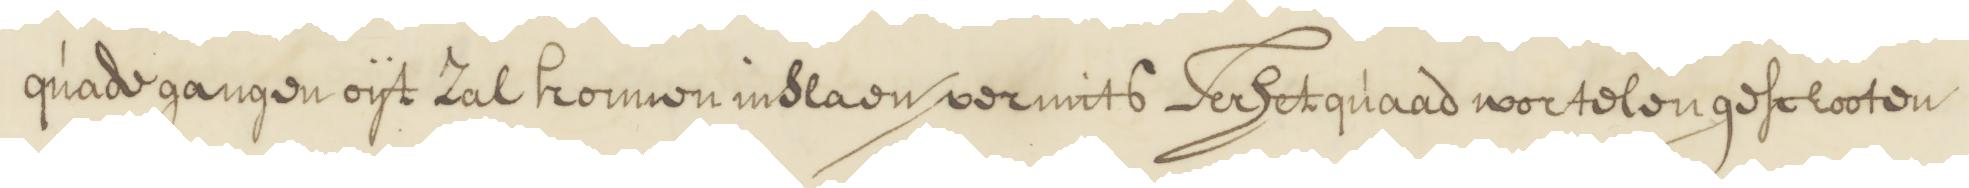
quade gangen oijt zal konnen inslaen vermits Eer het quaad wortelen geschooten
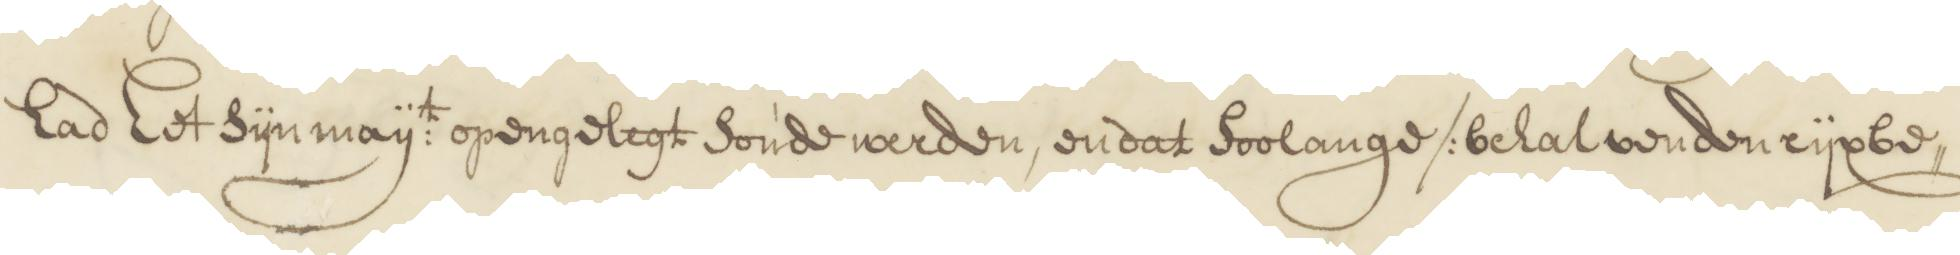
had het sijn maij:t opengelegt soude werden, en dat soolange /:behalven den rijxbe„
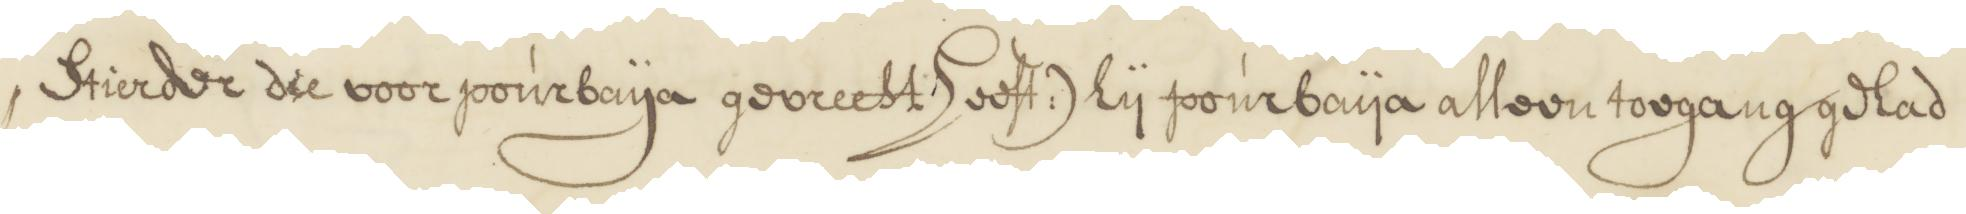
„stierder die voor pourbaija gevreest heeft:) hij pourbaija alleen toegang gehad
